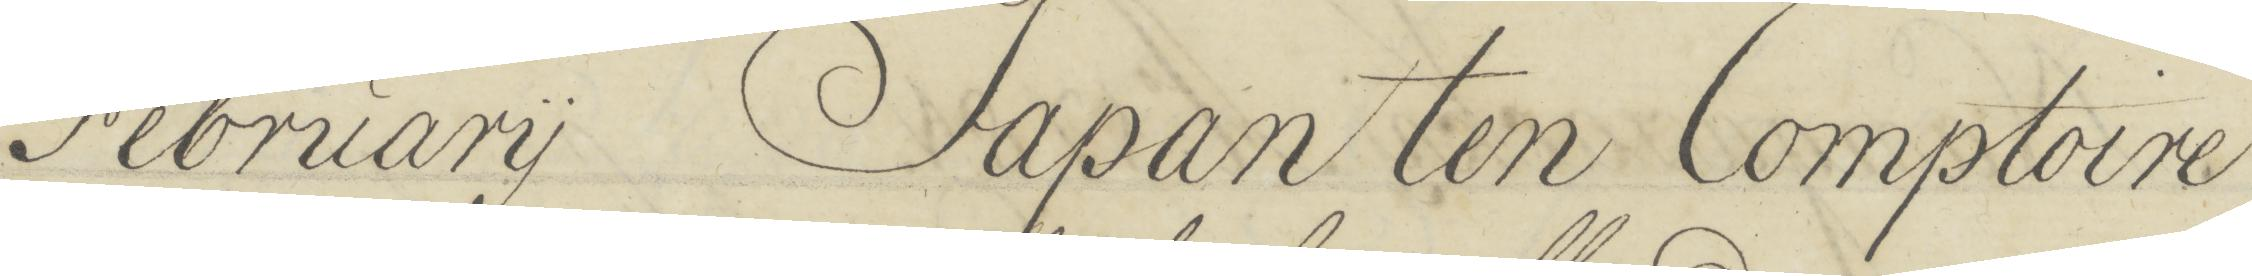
Februarij Iapan ten Comptoire
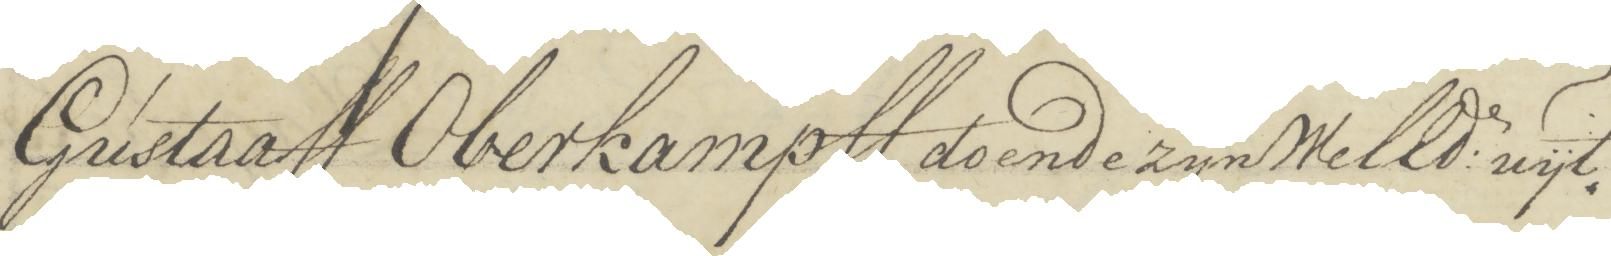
Gustaaff Oberkampff, doende zijn welEd:e uijt„
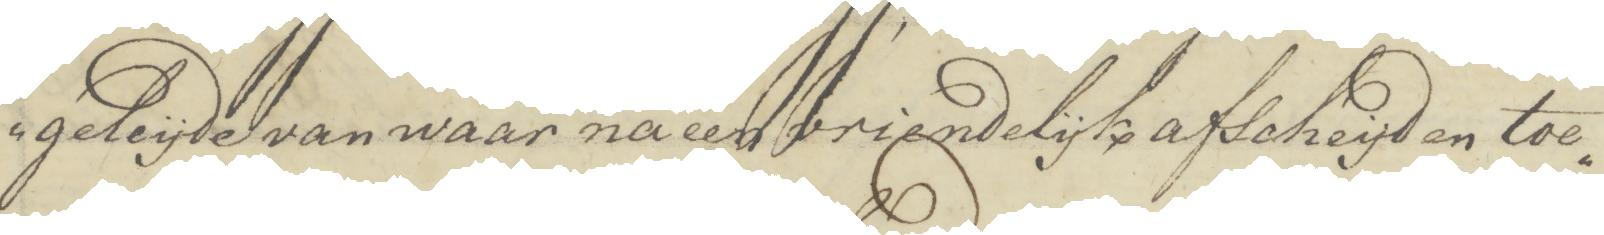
„geleijde van waar na een vriendelijk afscheijd en toe„
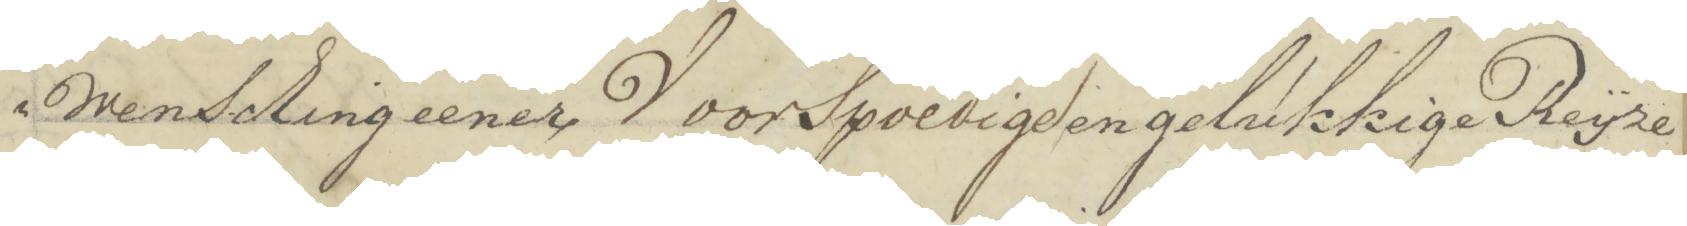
„wensching eener Voorspoedige en gelukkige Reijze
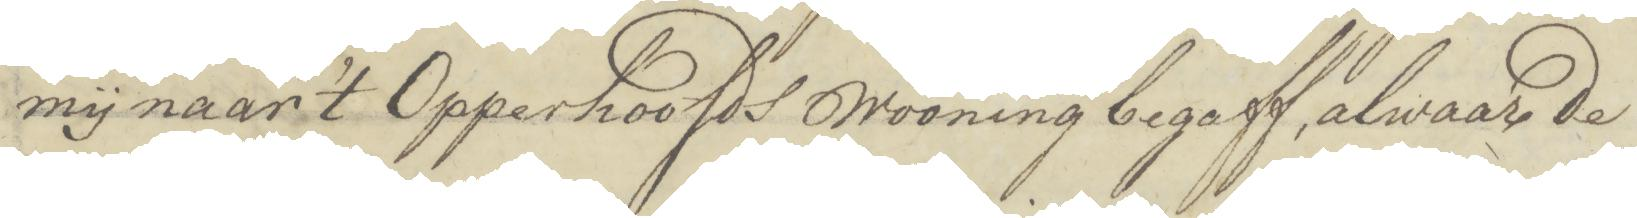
mij naar ’t Opperhoofds wooning begaff, alwaar de
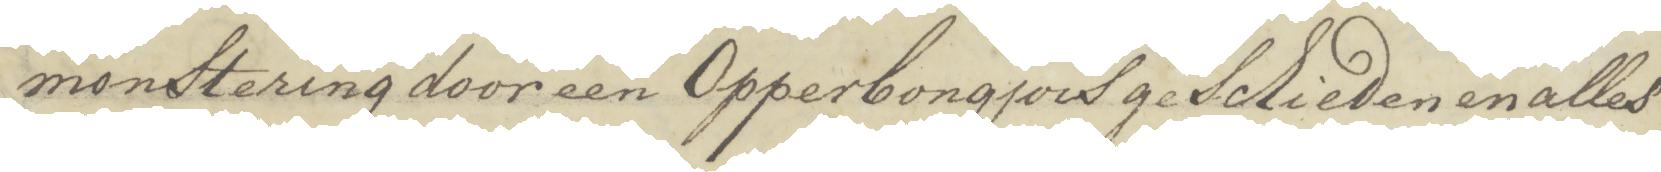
monstering door een Opperbongjois geschieden en alles
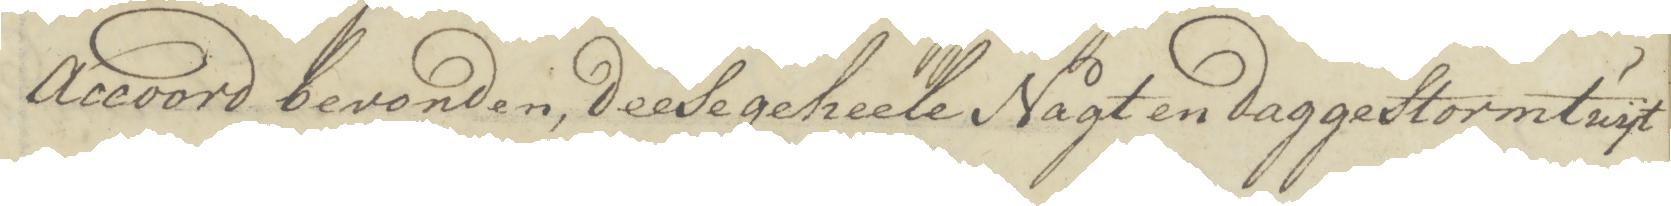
Accoord bevonden, deese geheele Nagt en dag gestormt uijt
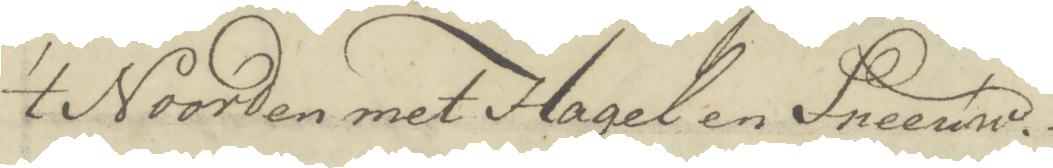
’t Noorden met Hagel en Sneeuw.
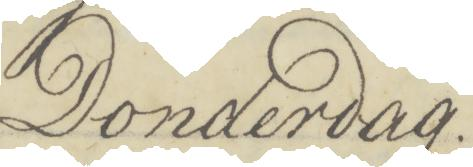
Donderdag.
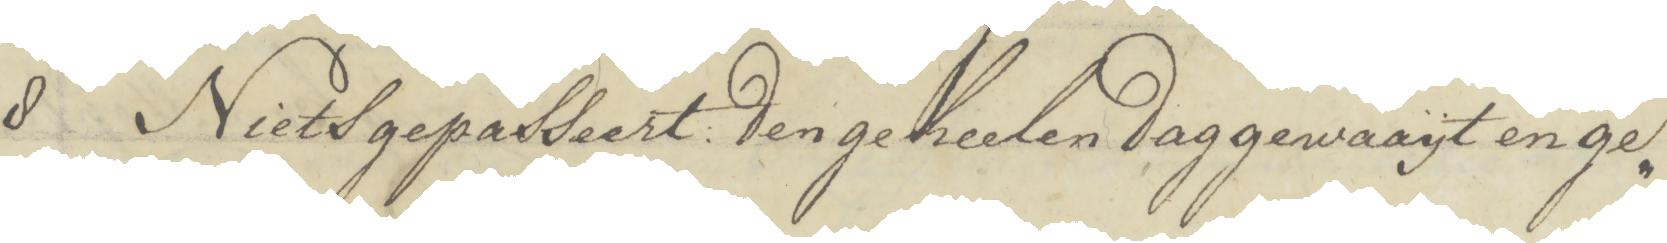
8 Niets gepasseert: den geheelen dag gewaaijt en ge„
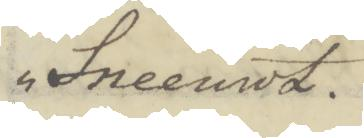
„sneeuwt.
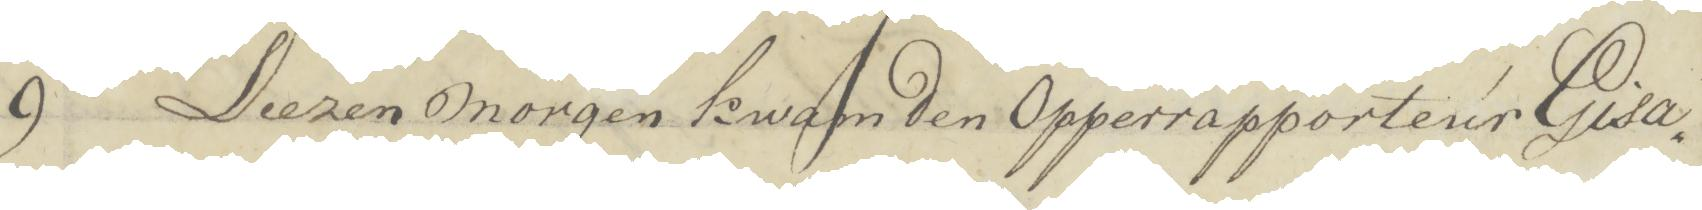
9: Deezen morgen kwam den Opperrapporteur Gisa„
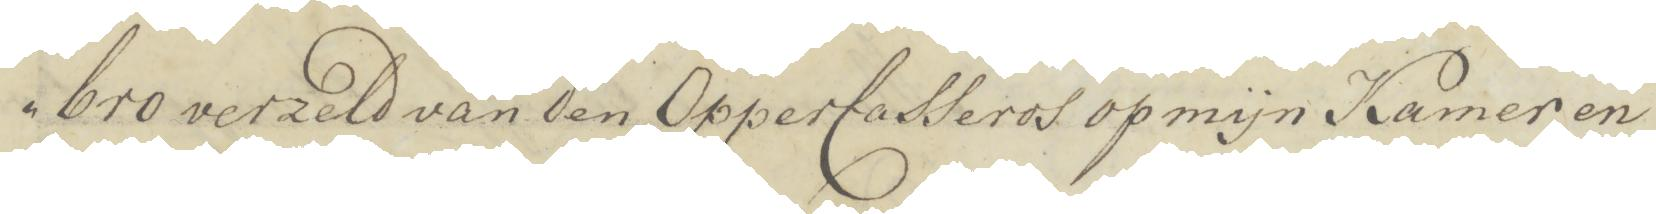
„bro verzeld van den Oppercasseros op mijn Kamer en
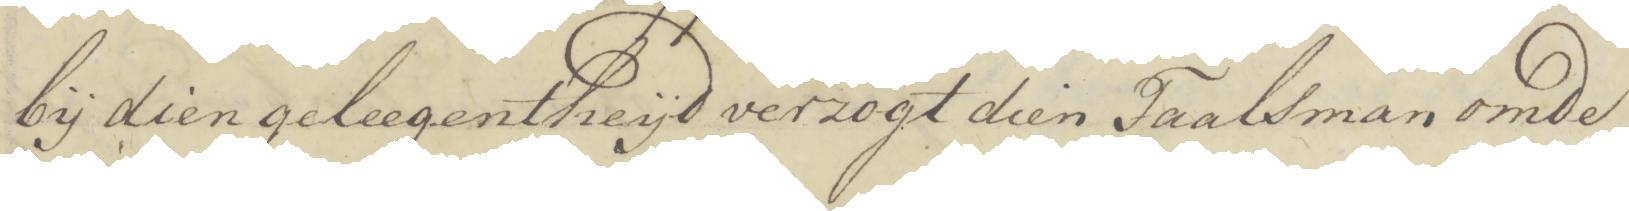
bij dien geleegentheijd verzogt dien Taalsman omde
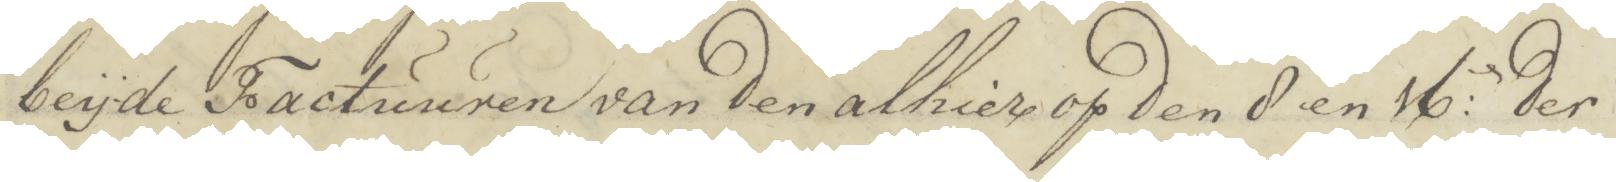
beijde Factuuren van den alhier op den 8 en 16:en der
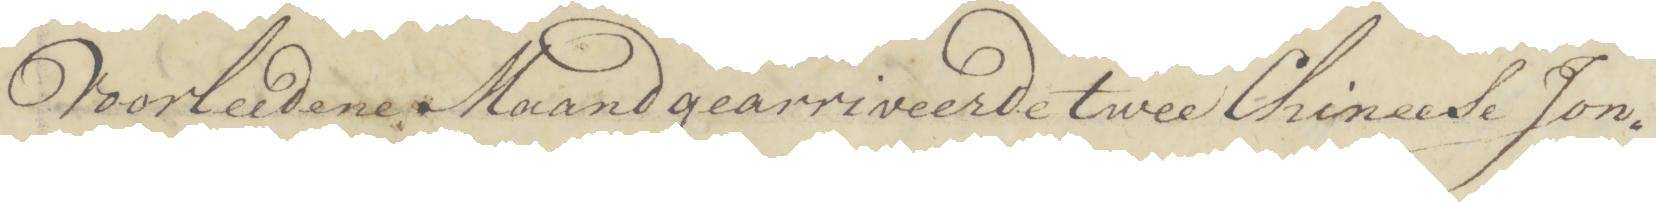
voorleedene Maand gearriveerde twee Chineese Jon„
